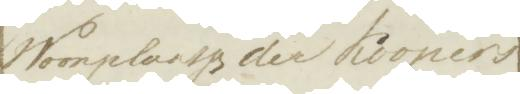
Woonplaatsen der Koopers
